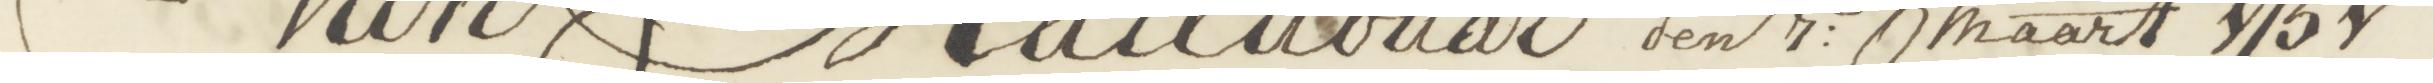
Van Mallabaar den 7:e Maart 1751
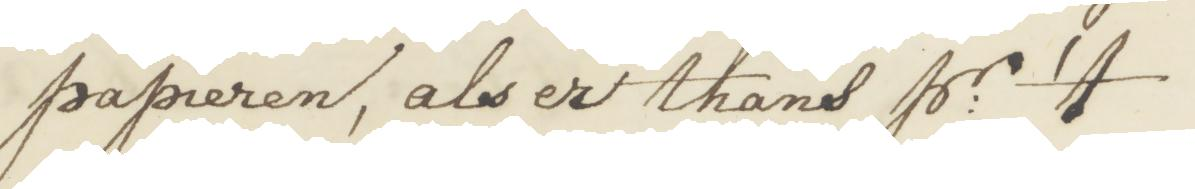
papieren, als er thans p:r 't
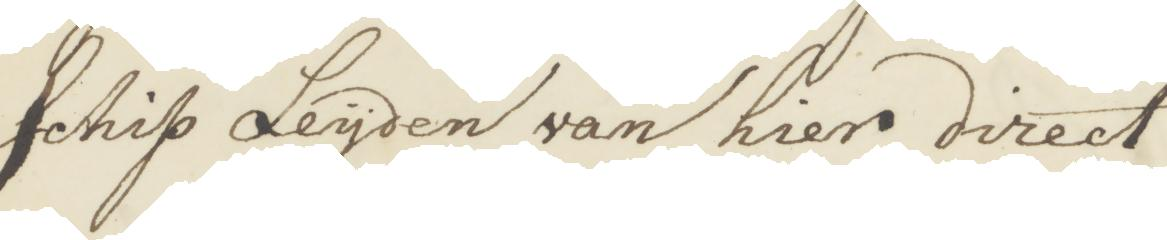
schip Leijden van hier direct
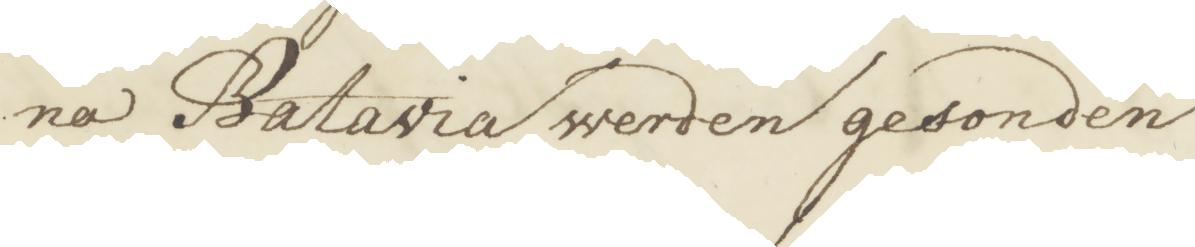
na Batavia werden gesonden
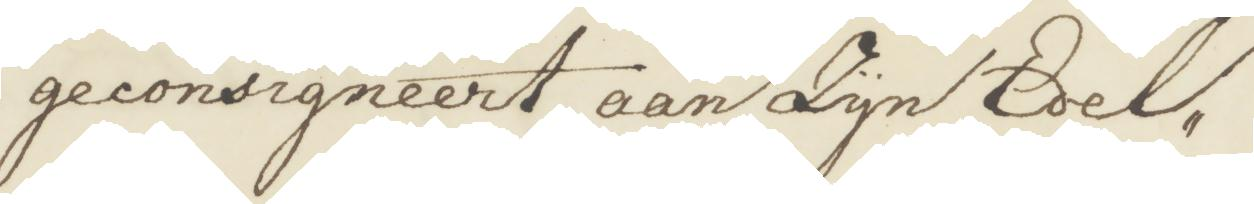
geconsigneert aan zijn Edel„
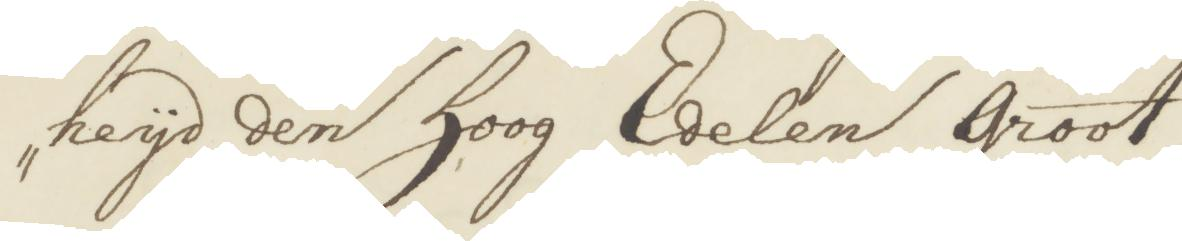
„heijd den hoog Edelen groot
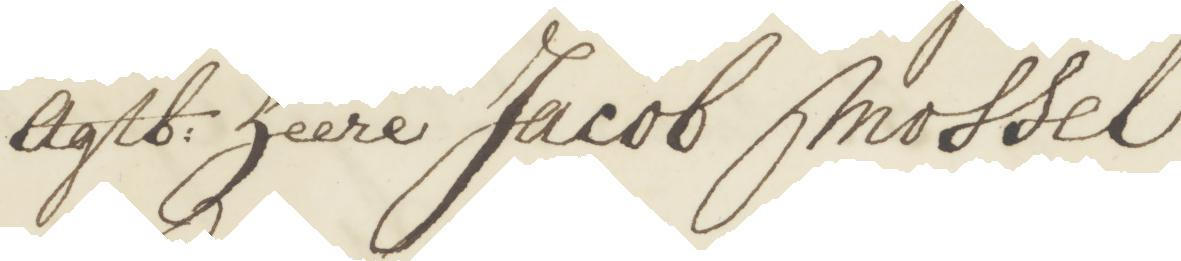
agtb: heere Jacob Mossel
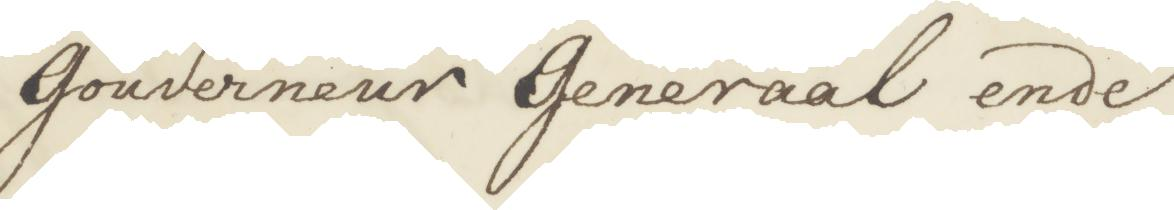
Gouverneur Generaal ende
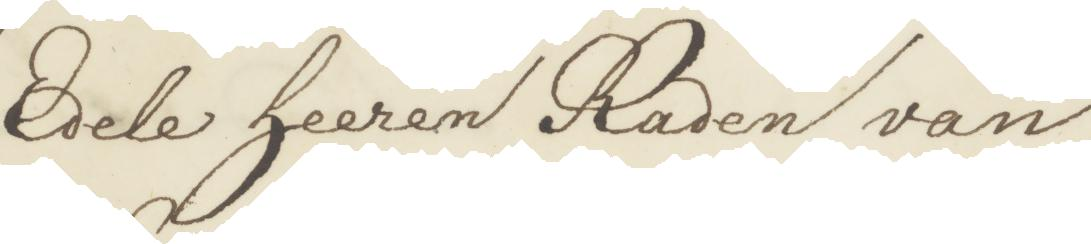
Edele heeren Raden van
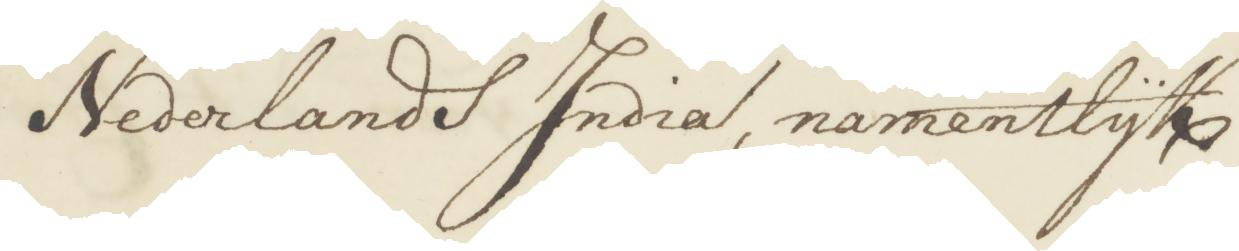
Nederlands Jndia, namentlijk
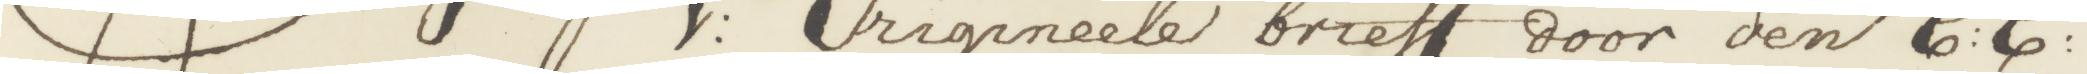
N„o 1: Origineele brieff door den E:E:
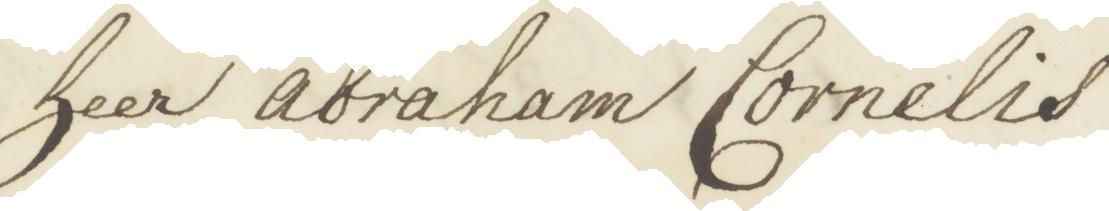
heer abraham Cornelis
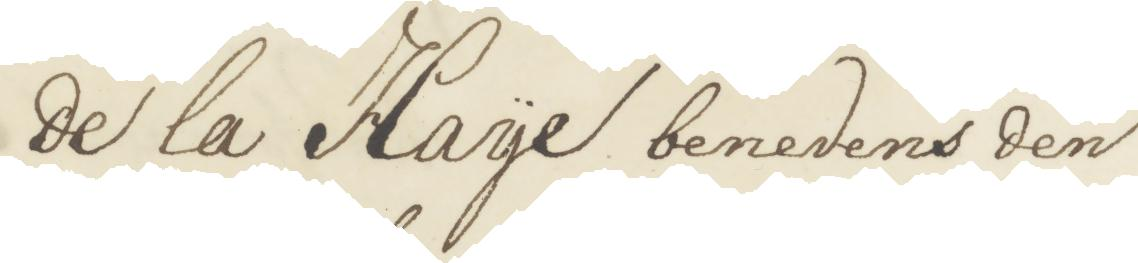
de la Haije benevens den
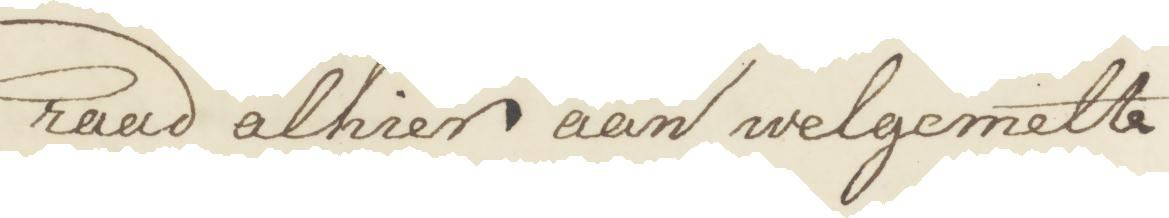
raad alhier aan welgemelte
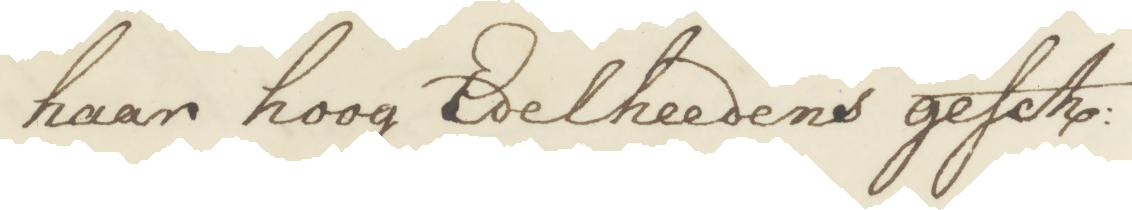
haar hoog Edelheedens gesch:
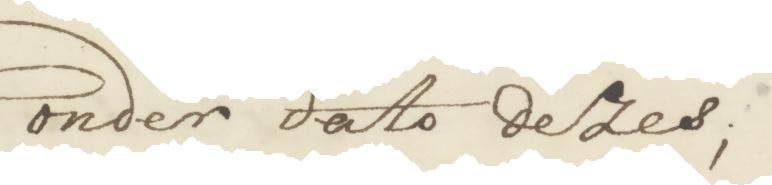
onder dato dezes;
